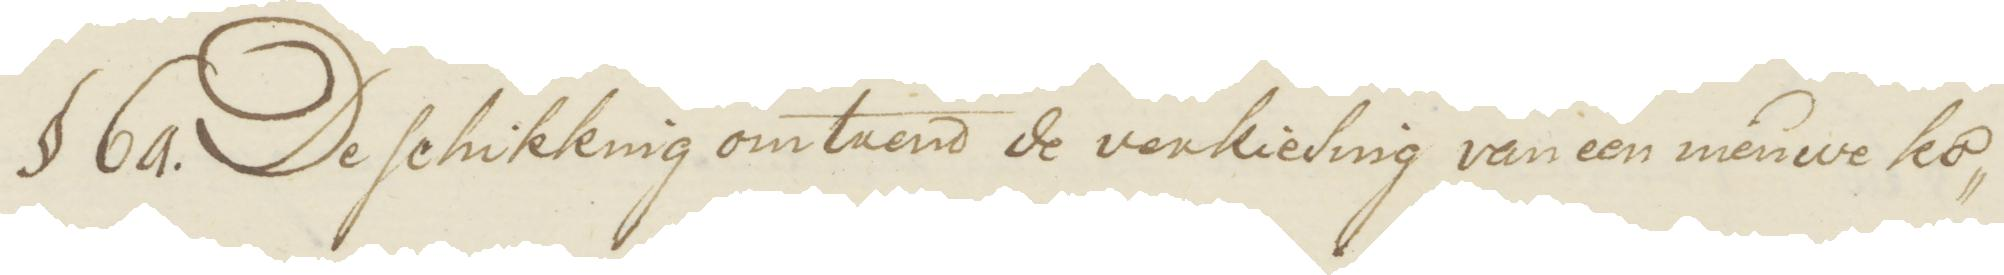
§ 64. De schikking omtrend de verkiesing van een nieuwe ko„
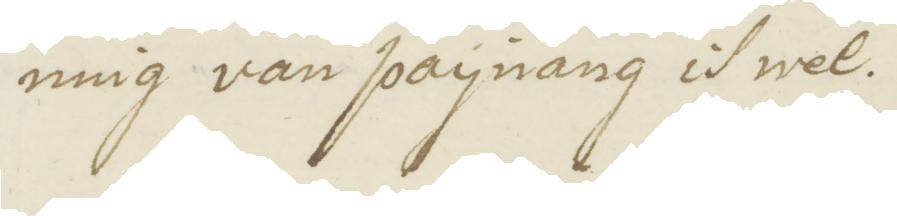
ning van paijnang is wel.
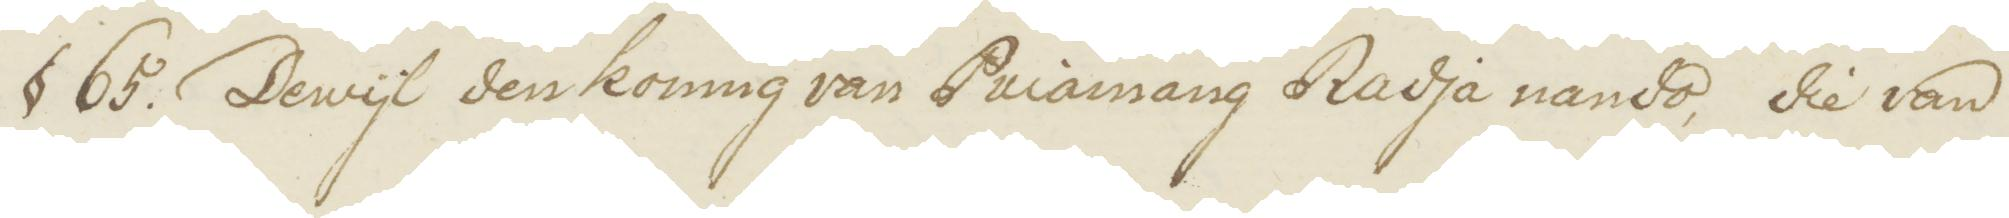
§ 65. Dewijl den koning van Priamang Radja nando, die van
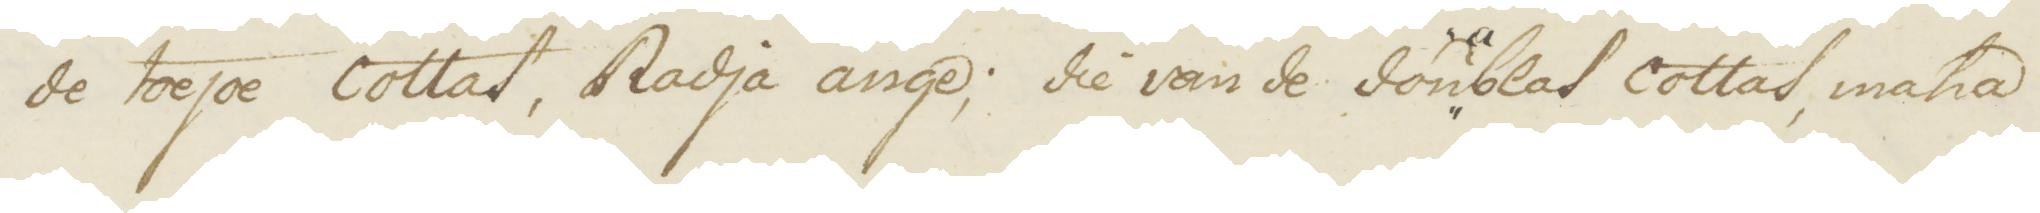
de toejoe Cottas, Radja ange, die van de donablas Cottas, maha
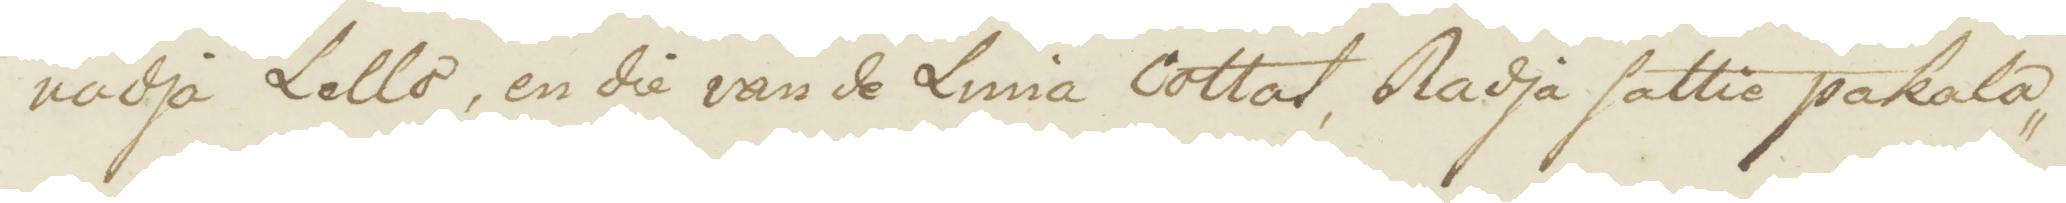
radja Lello, en die van de Lima Cottas, Radja sattie pakala„
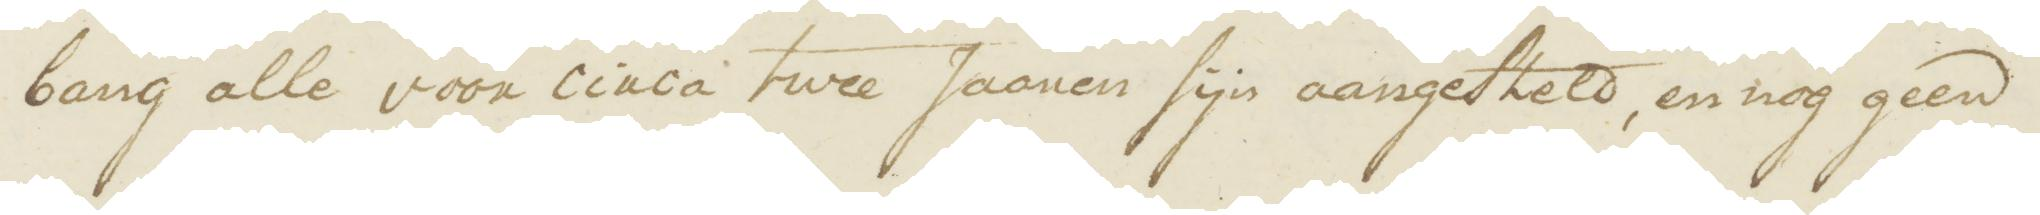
bang alle voor circa twee Jaaren sijn aangesteld, en nog geen
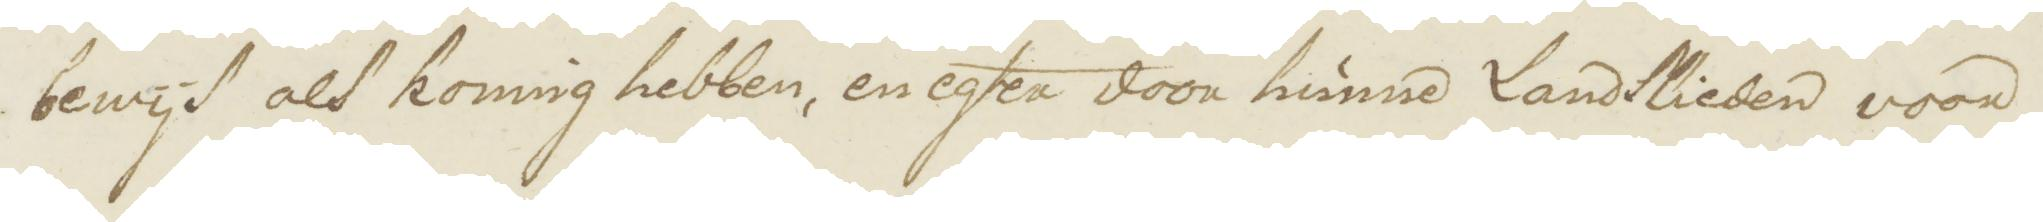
bewijs als koning hebben, en egter door hunne Landslieden voor
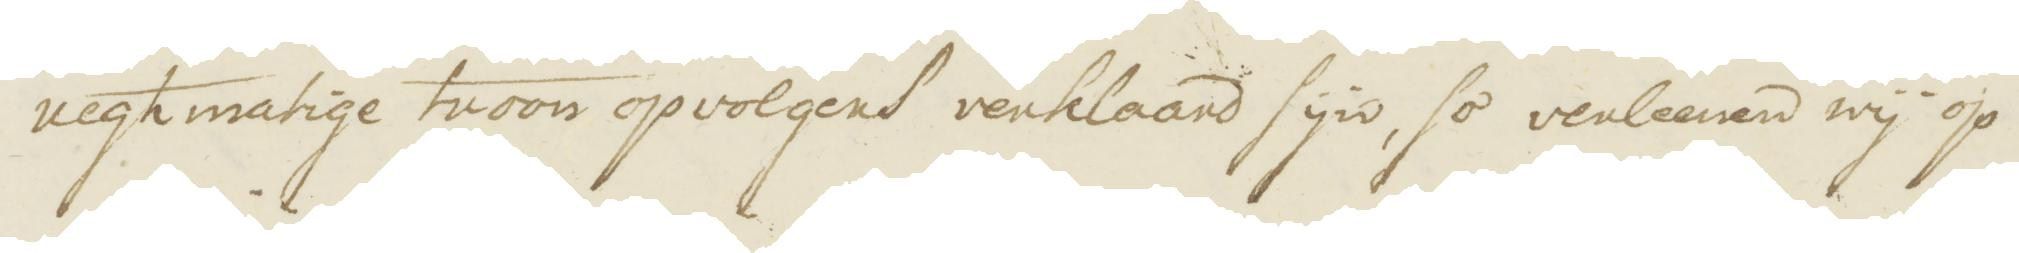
regtmatige troon opvolgers verklaard sijn, so verleenen wij op
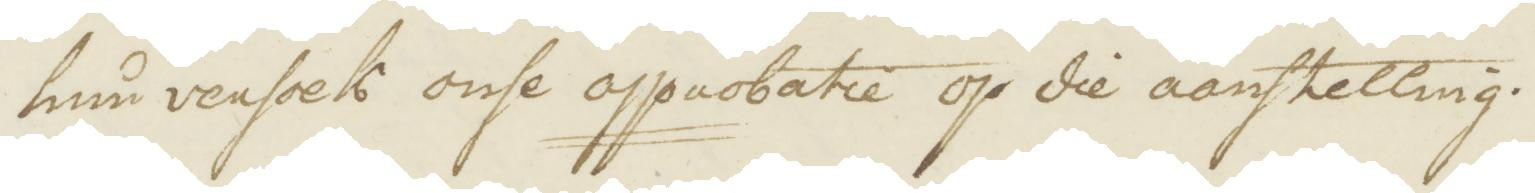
hun versoek onse approbatie op die aanstelling.
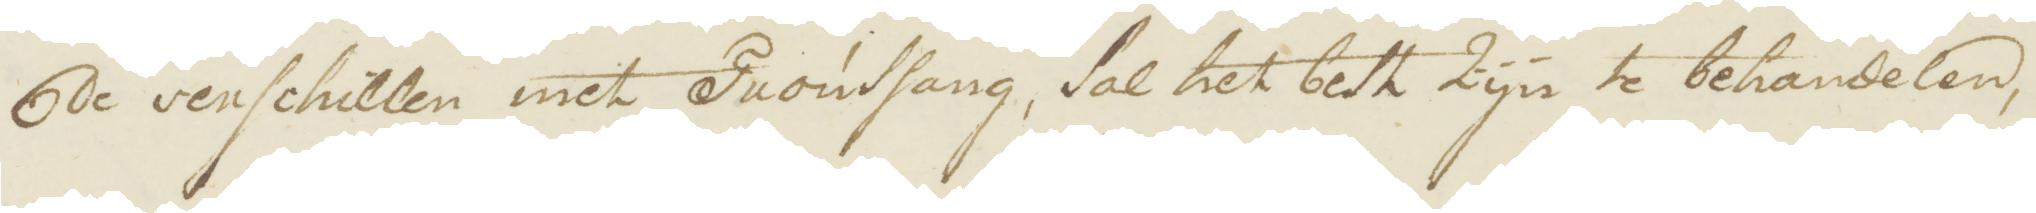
de verschillen met Troussang, sal het best zijn te behandelen„
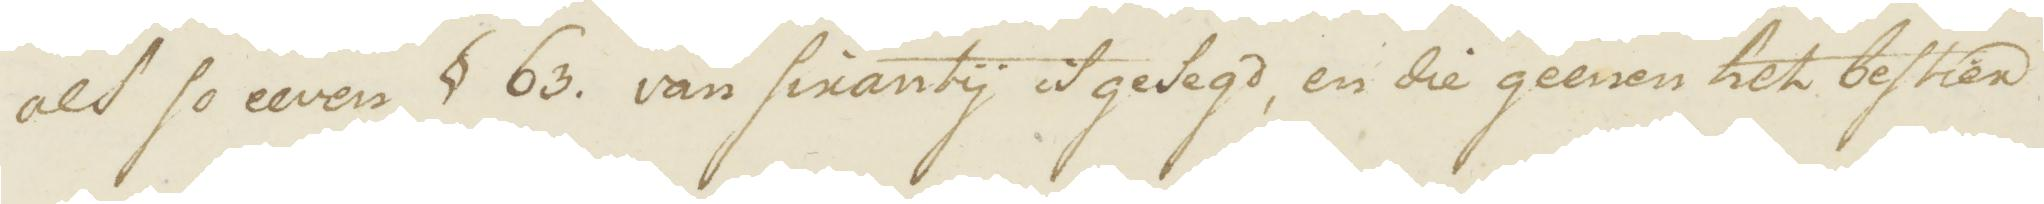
als so eeven § 63. van sirantij is gesegd, en die geenen het bestier
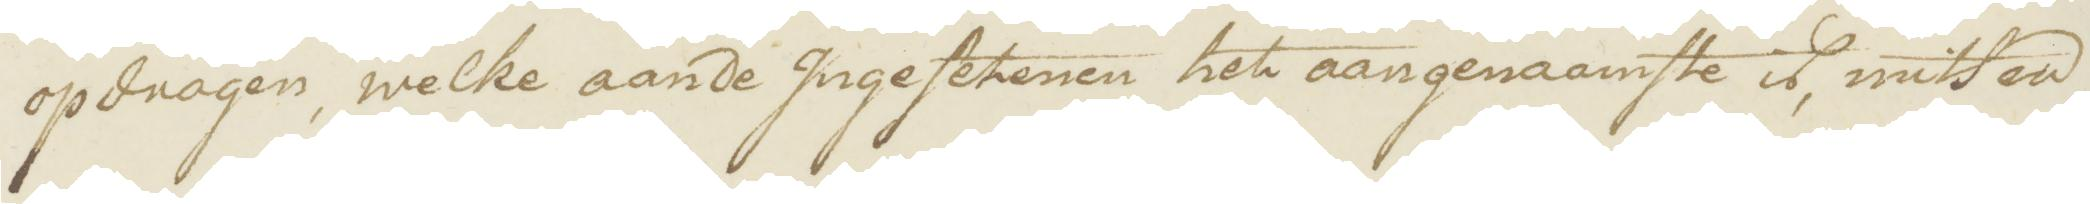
opdragen, welke aan de Ingesetenen het aangenaamste is, mits er
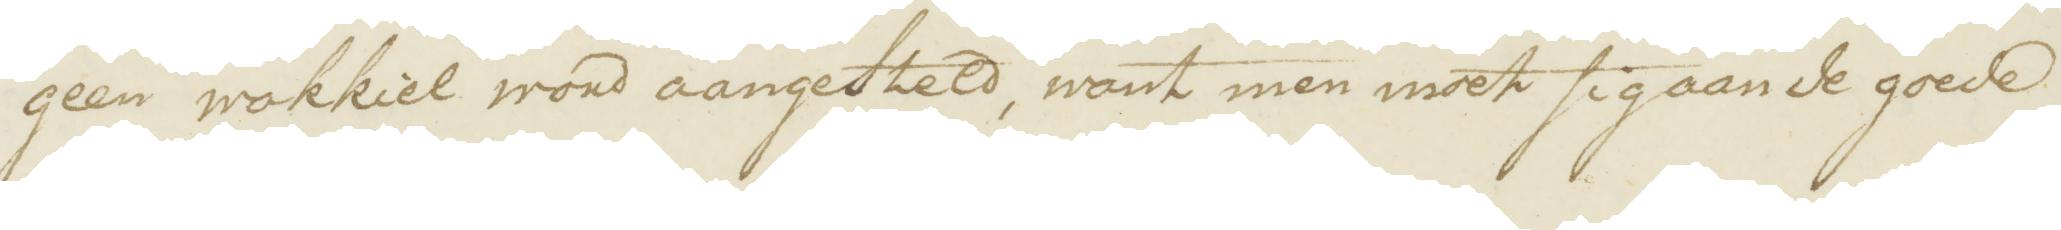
geen wakkiel word aangesteld, want men moet sig aan de goede
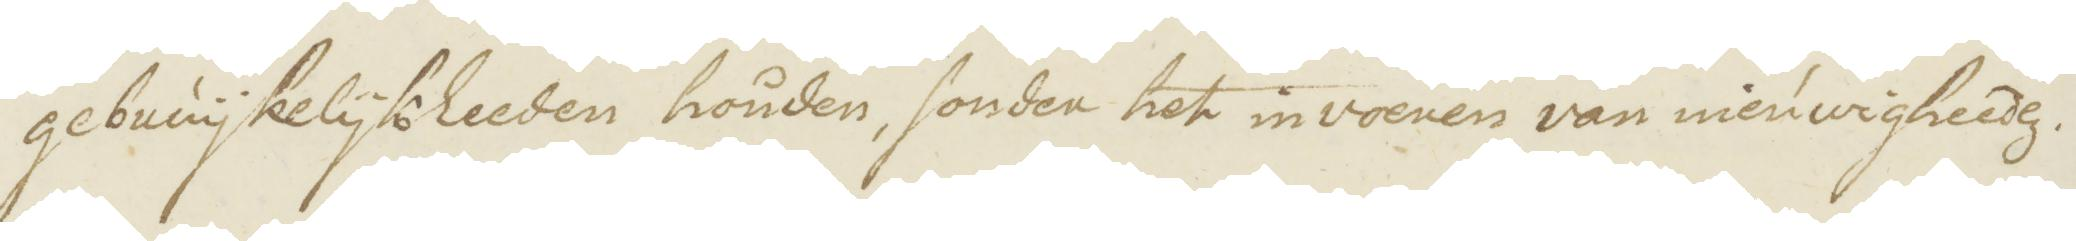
gebruijkelijkheeden houden, sonder het invoeren van nieuwigheeden.
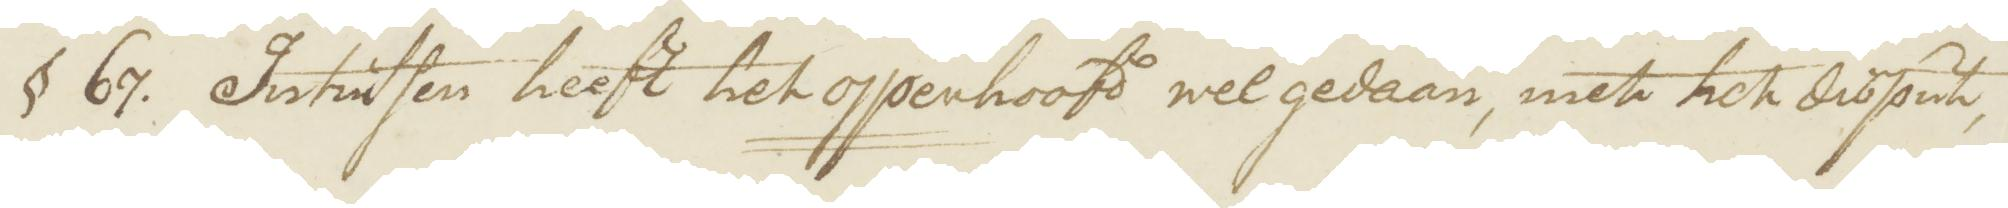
§ 67: Intussen heeft het opperhoofd wel gedaan, met het disput,
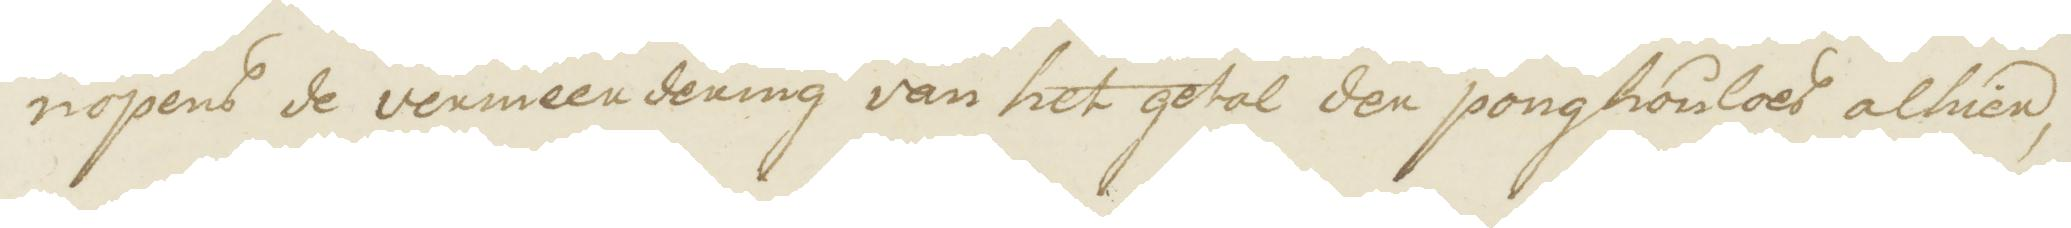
nopens de vermeerdering van het getal der ponghouloes alhier,
